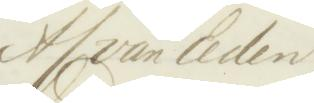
AC van Eeden
